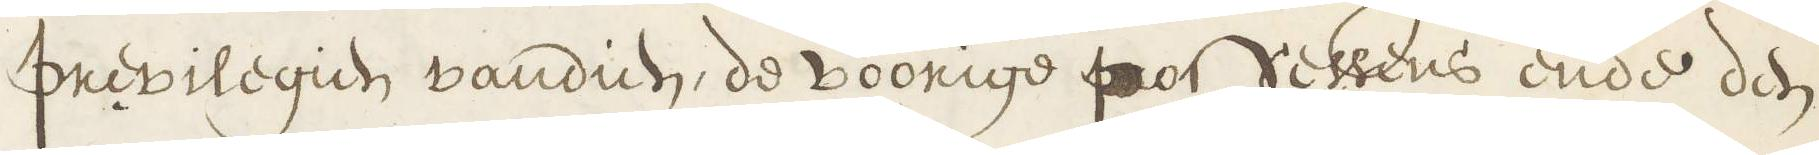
previlegien vandien, de voorige possessens ende den
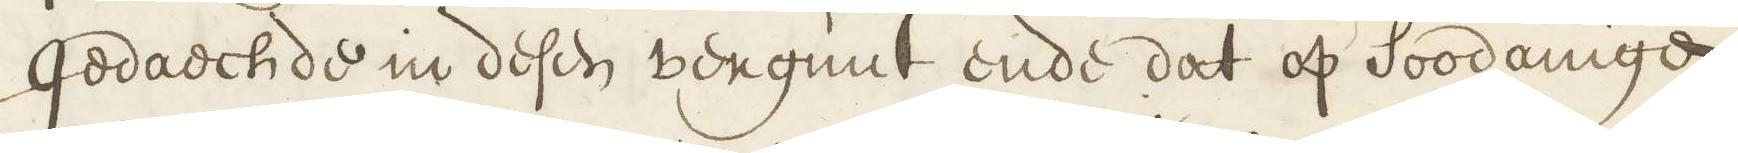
gedaechde in desen vergunt ende dat op soodanige
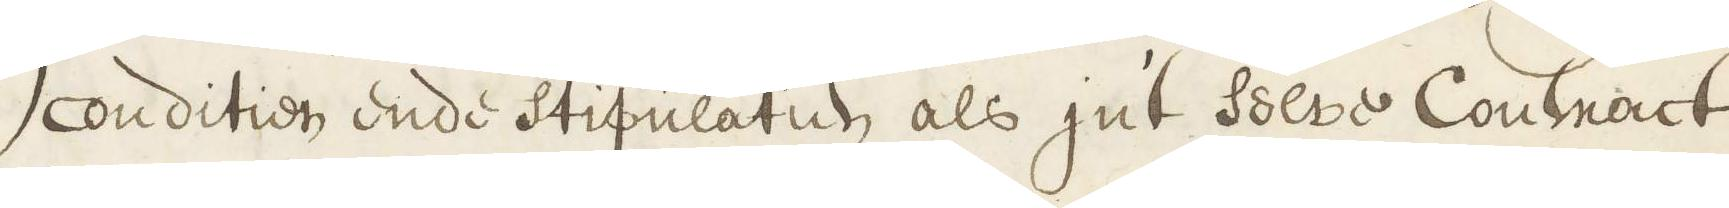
conditien ende stipulatien als jn't selve Contract
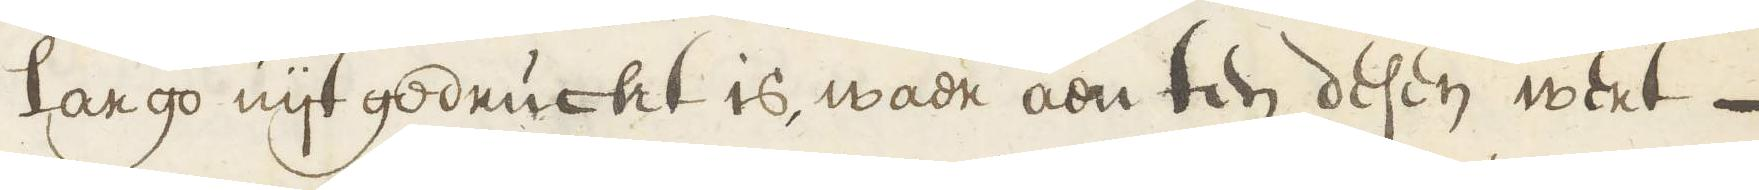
largo uijt gedruckt is, waer aen ten desen wert—
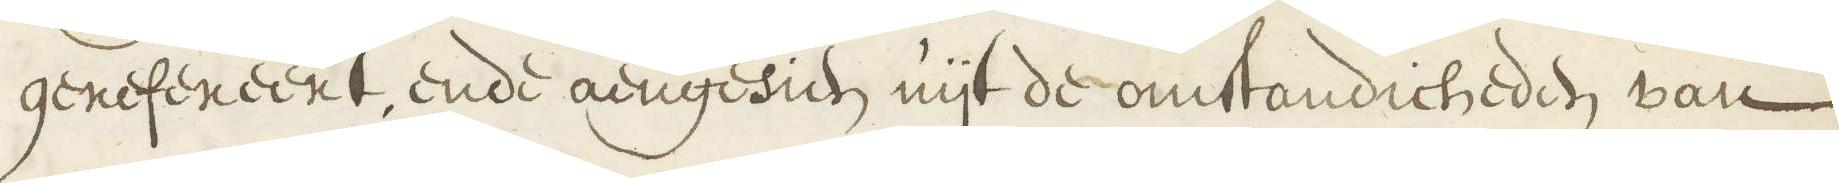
gerefereert, ende aengesien uijt de omstandicheden van
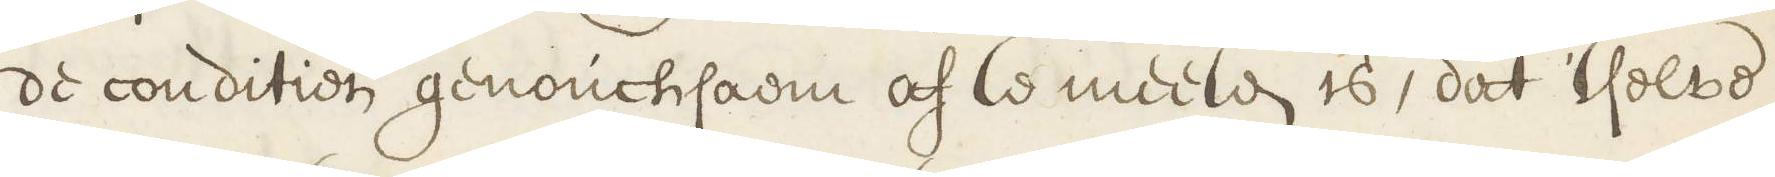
de conditien genouchsaem af te meeten is, dat 'tselve
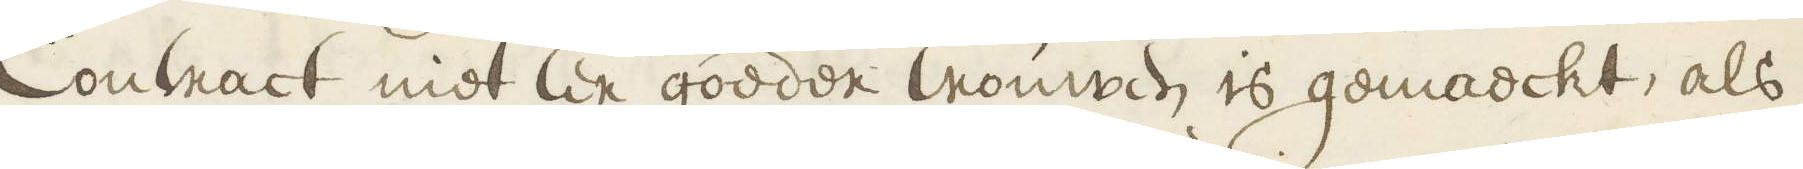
Contract niet ter goeder trouwen is gemaeckt, als
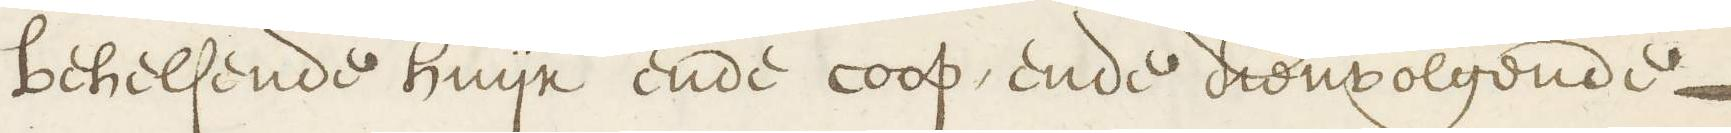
behelsende huijr ende coop, ende dienvolgende_
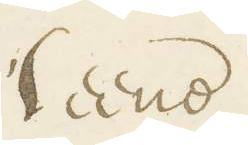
't eene
